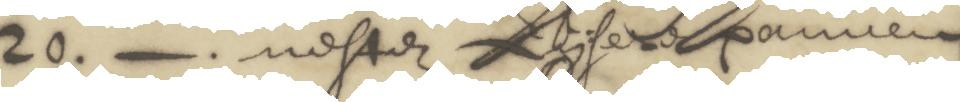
20. — . nesten Eijsere pannen
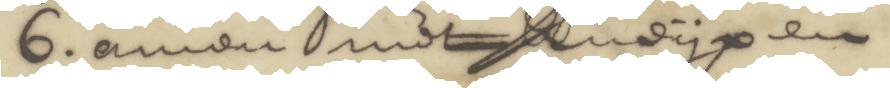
6. amen met Kuijpen
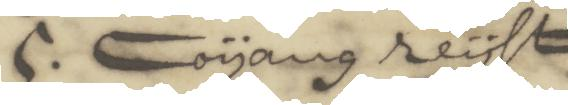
5. Coijang reijst
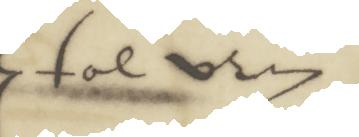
tol vrij
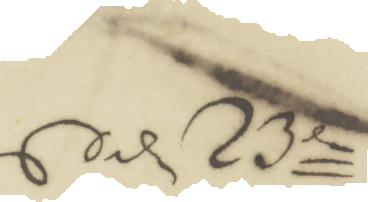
den 23=e
